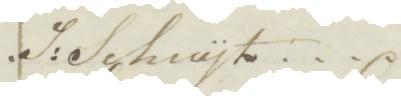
J: Schuijt . . . . . . . . .
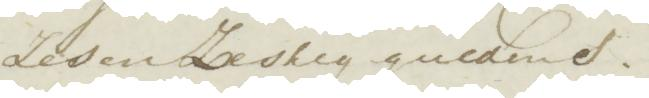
Zesen Zestig guldens. . . . . . .
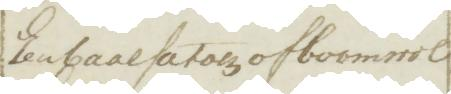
Een baal catoen of boomwol
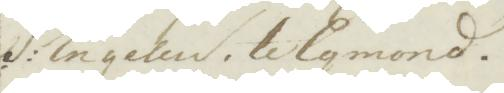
I: Engelen, te Egmond.
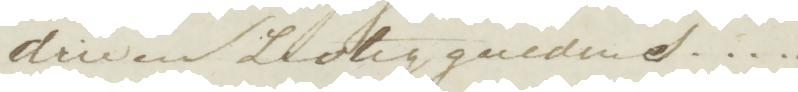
drie en Zestig guldens. . . .
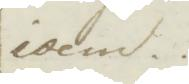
idem. . . . . . . . . . . . . . .
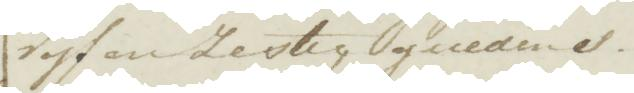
vyf en Zestig guldens. . . . . . .
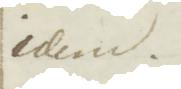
idem. . . . . . . . . . . .
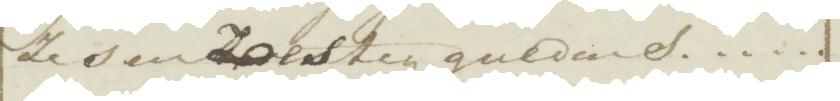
Zes en Zestig guldens . . . . . .
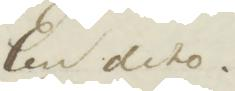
Een dito. . . . . . . .
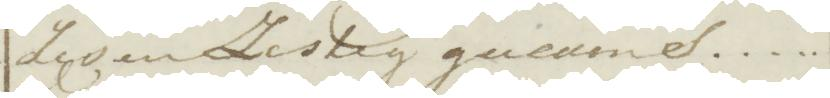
Zes en Zestig guldens. . . .
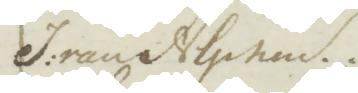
I: van Alphen. . . . . . . .
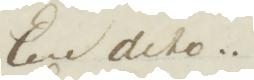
Eene dito. . . . . . .
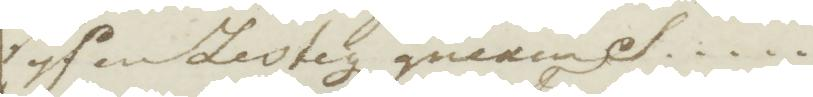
Vyf en Zestig guldens. . . . . . .
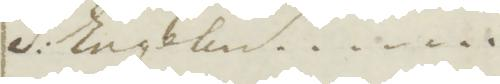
I: Engelen . . . . . . .
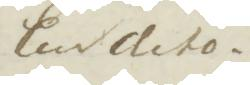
Een dito . . . . . . .
